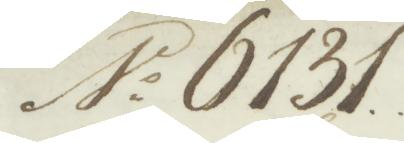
N„o 6131.
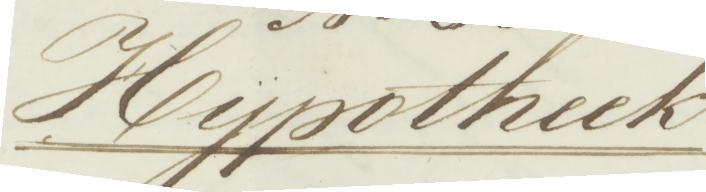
Hijpotheek
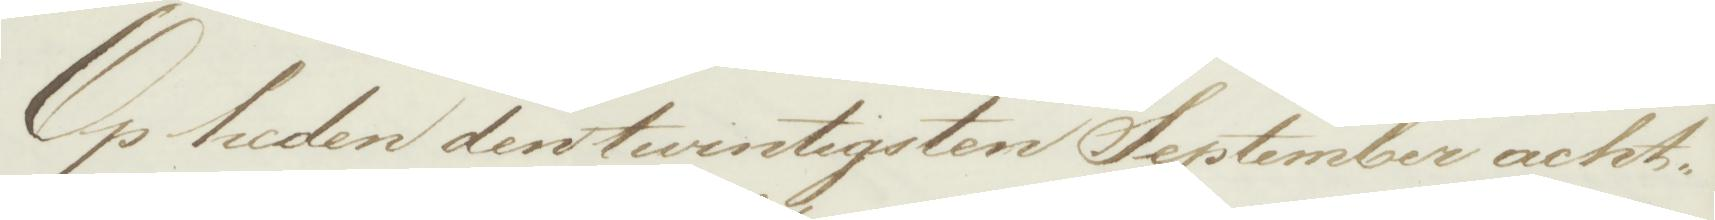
Op heden den twintigsten September acht„
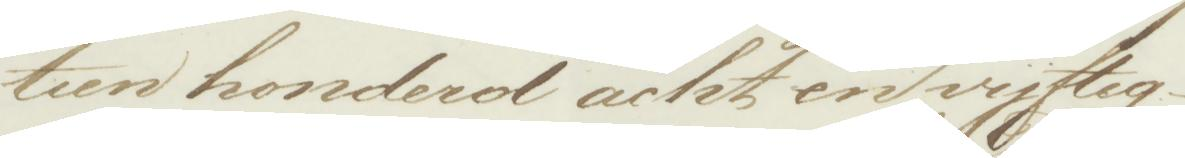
tien honderd acht en vijftig
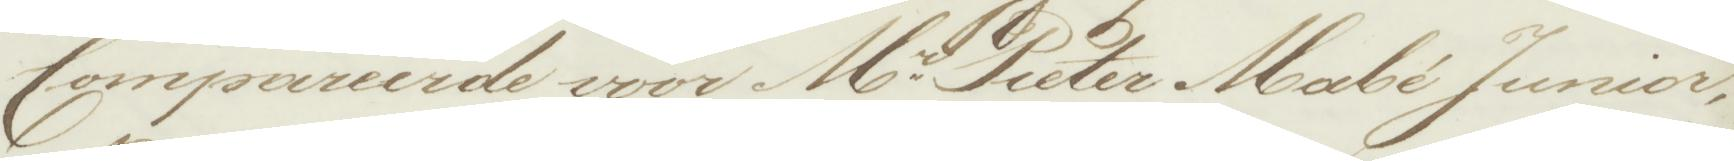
Compareerde voor M„r Pieter Mabé Junior,
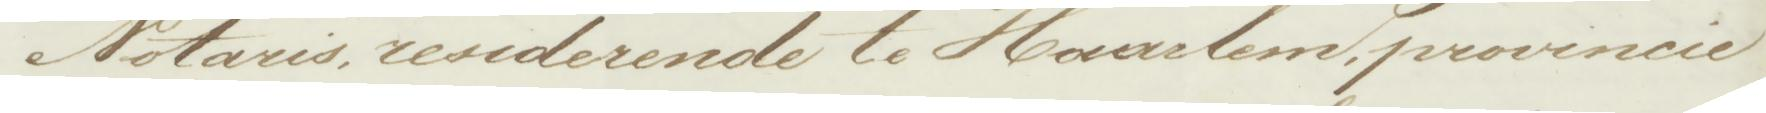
Notaris, residerende te Haarlem, provincie
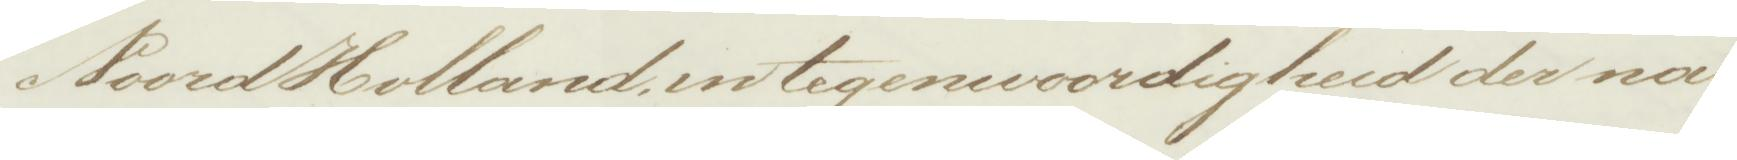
Noord Holland, in tegenwoordigheid der na
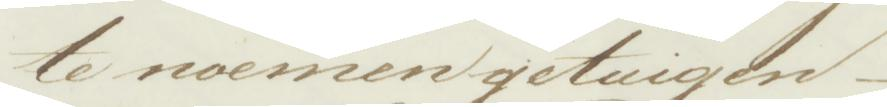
te noemen getuigen -
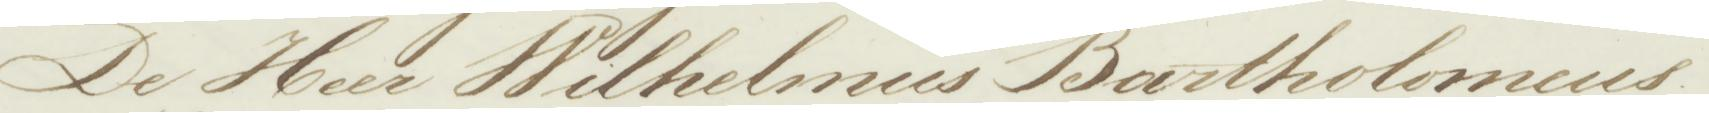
De Heer Wilhelmus Bartholomeus
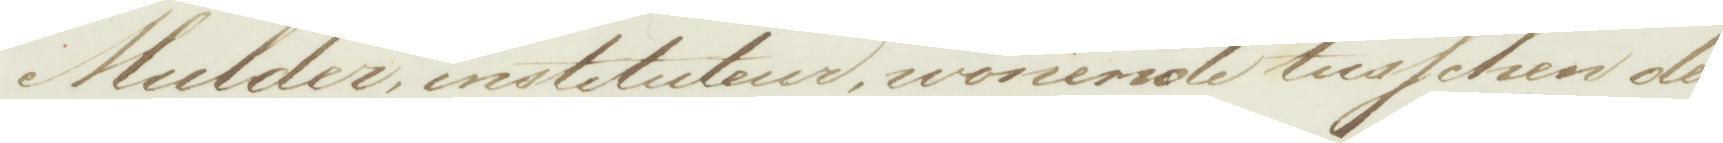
Mulder, instituteur, wonende tusschen de
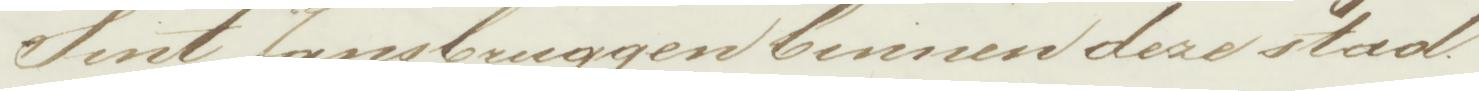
Sint Jansbruggen binnen deze stad.
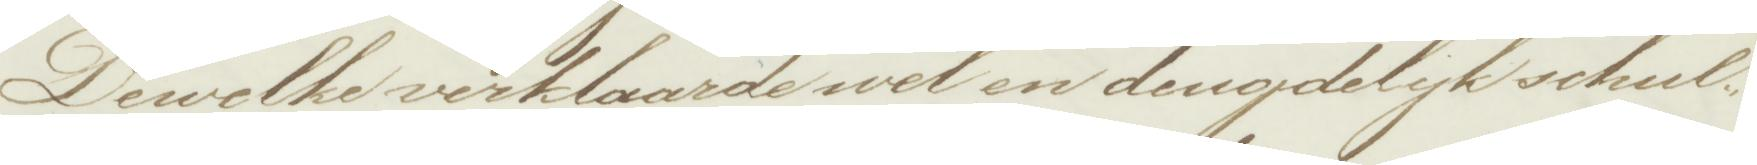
Dewelke verklaarde wel en deugdelijk schul„
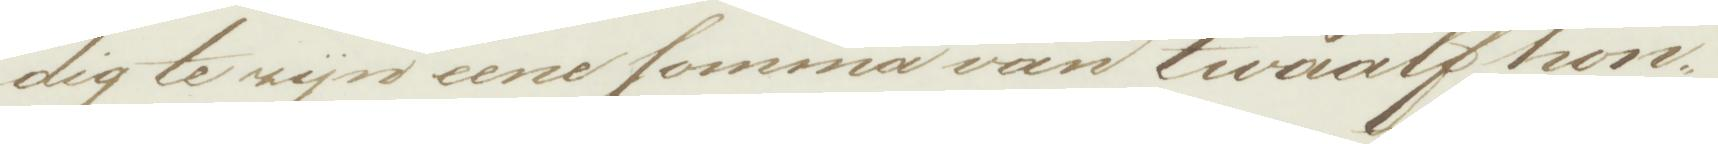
dig te zijn eene somma van twaalf hon„
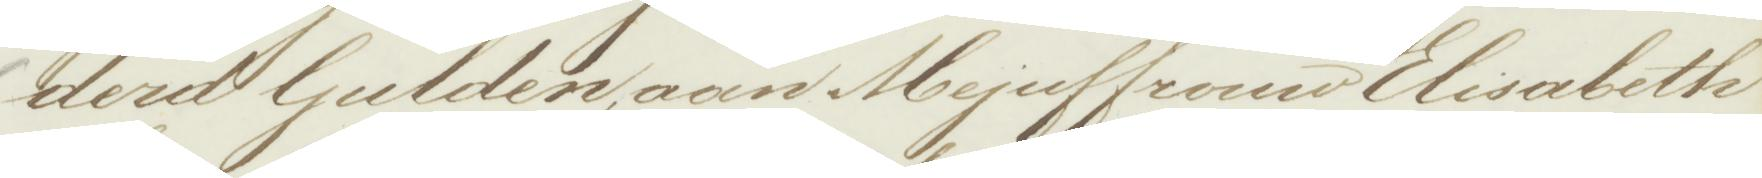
derd Gulden, aan Mejuffrouw Elisabeth
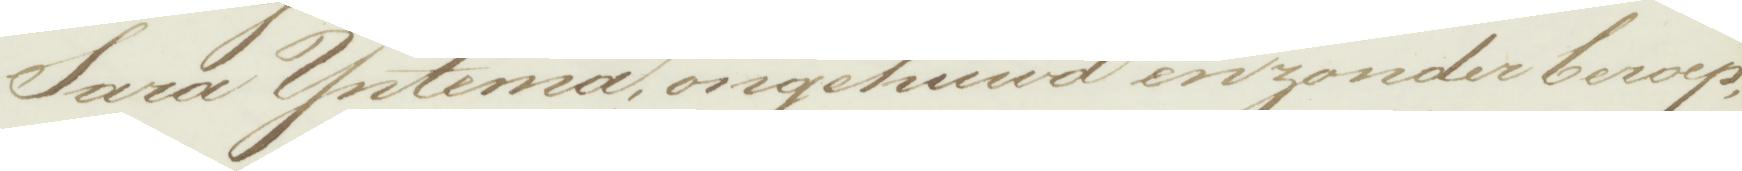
Sara Yntema, ongehuwd en zonder beroep,
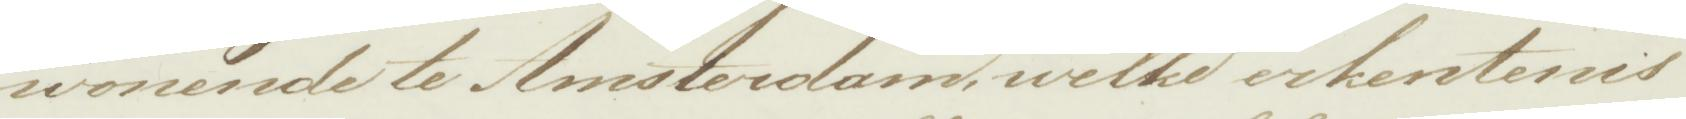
wonende te Amsterdam, welke erkentenis
